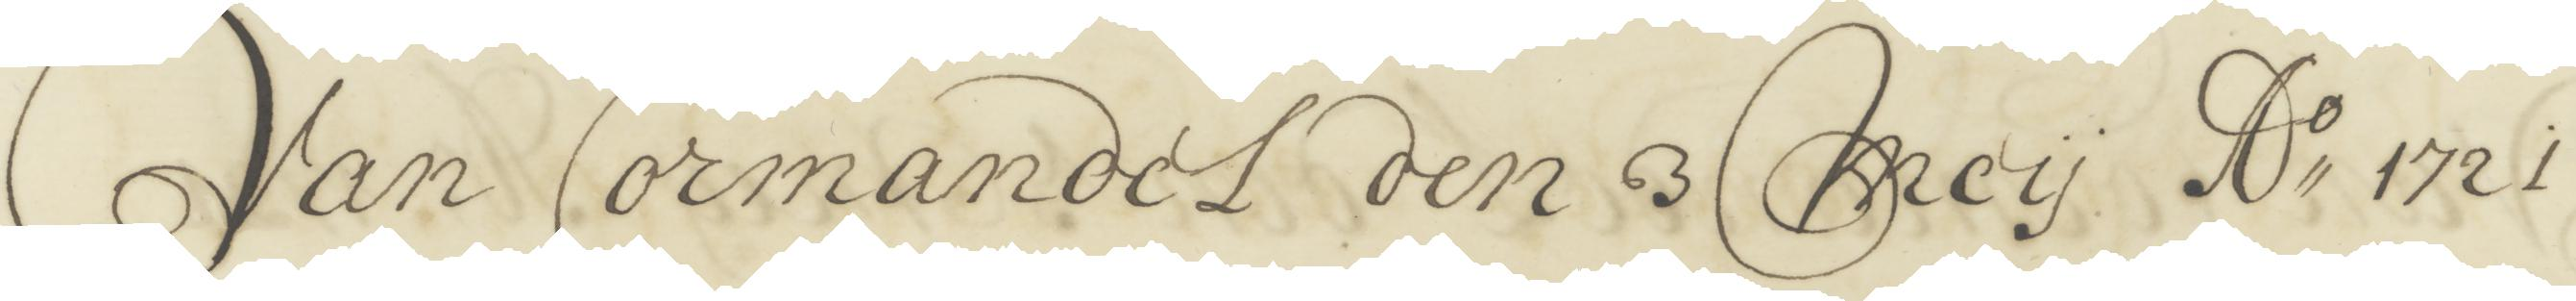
Van Cormandel den 3 Meij A„o 1721
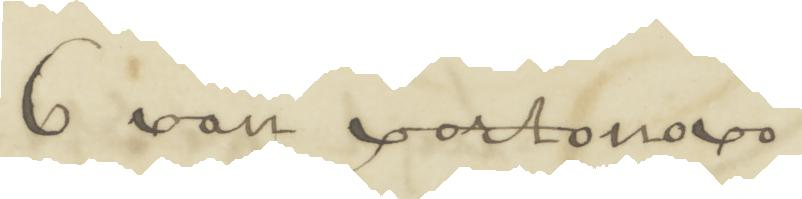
6 van portonovo
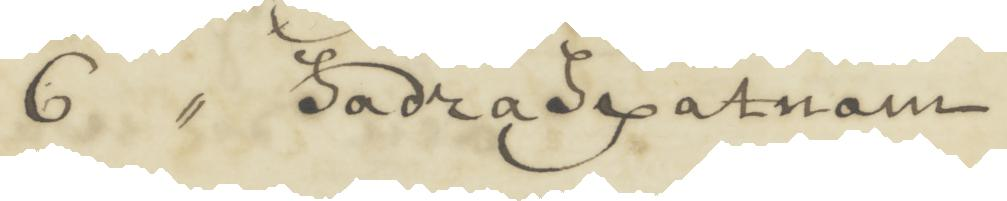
6 „ sadraspatnam
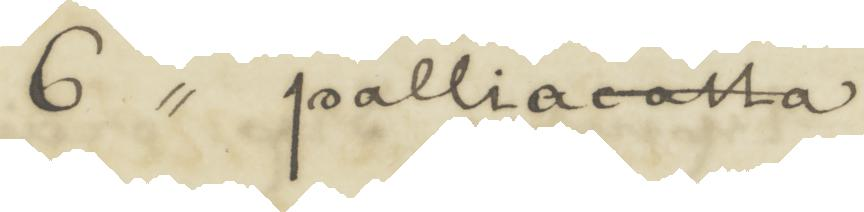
6 „ palliacatta
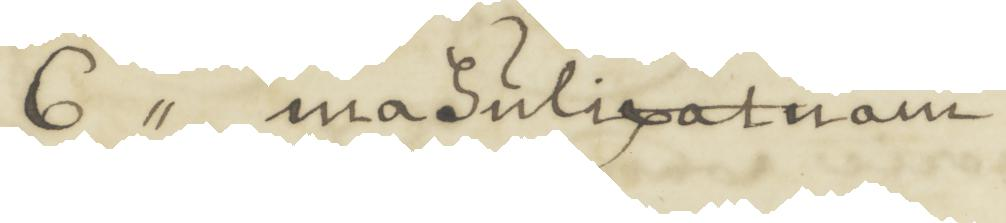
6 „ masulipatnam
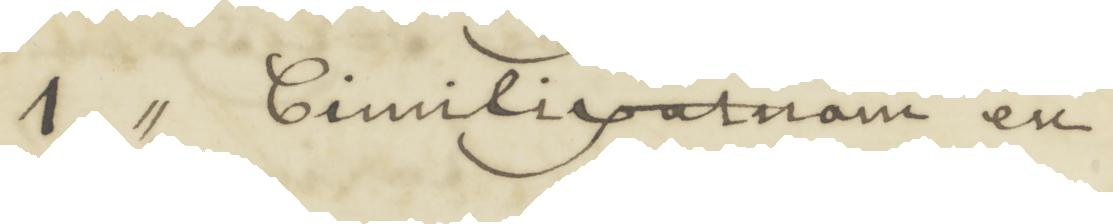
1 „ bimilipatnam en
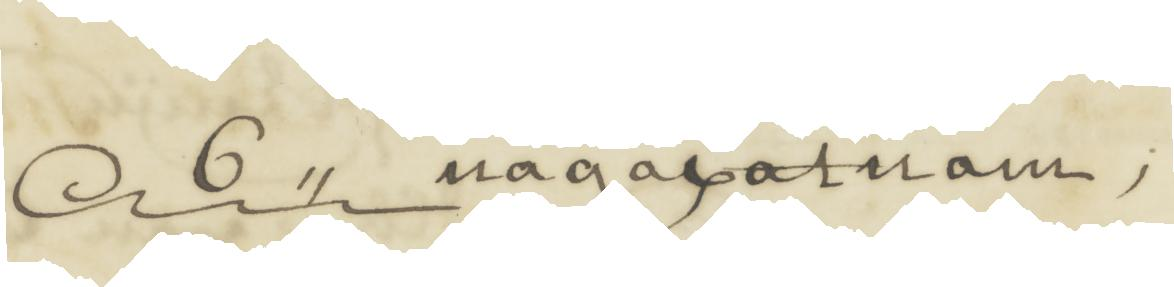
6 „ nagapatnam;
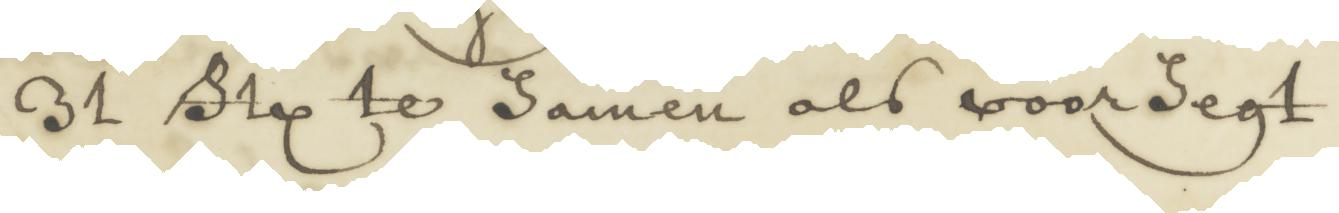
31 stx te samen als voorsegt
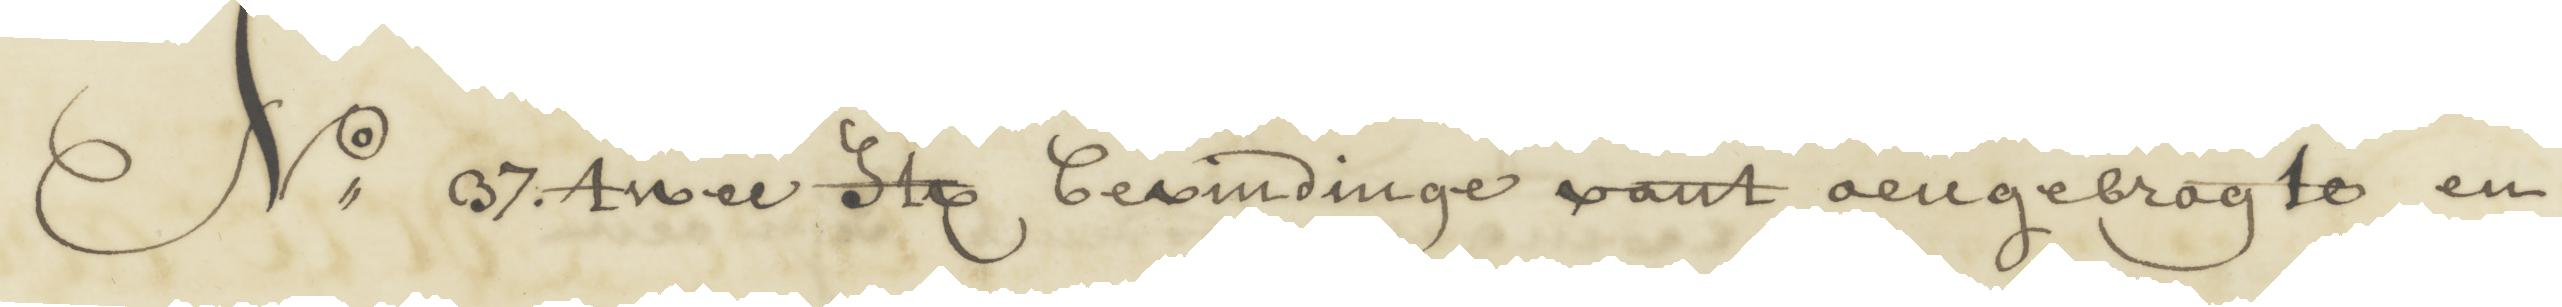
N„o 37. twee stx bevindinge van't aengebragte en
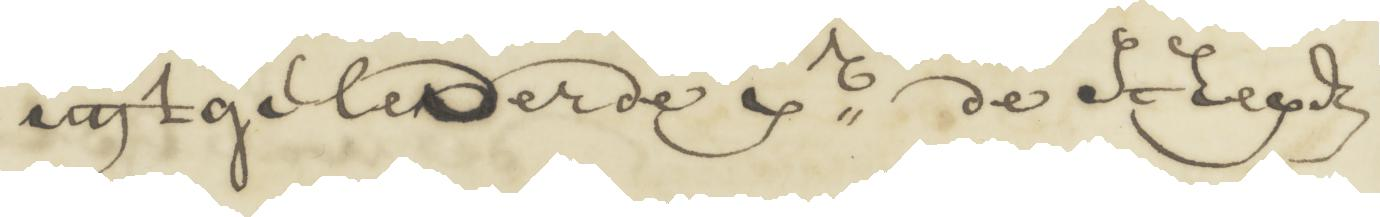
uijtgeleverde p„r de schepen
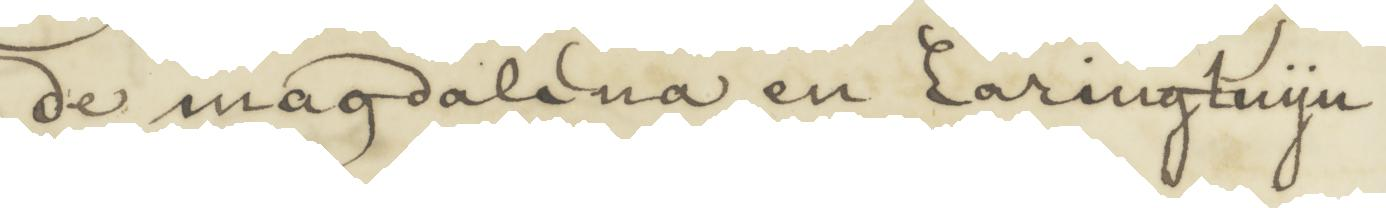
de magdalena en haringtuijn
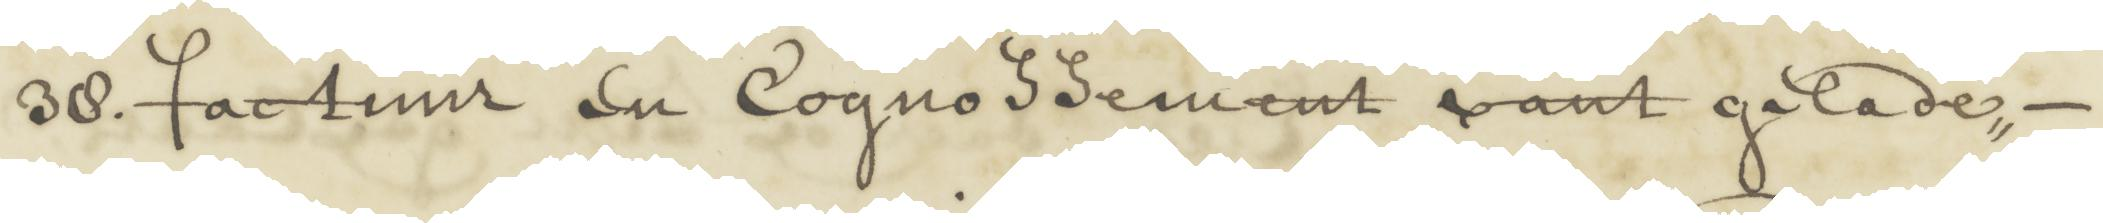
38. factuur en Cognossement van't gelade„ —
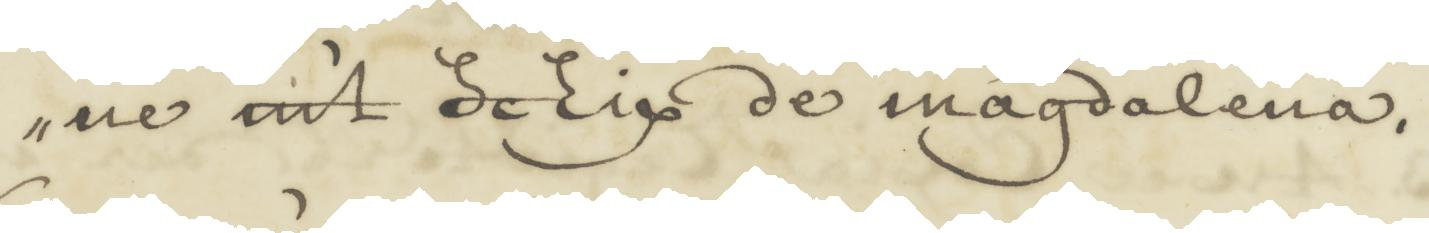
„ne in’t schip de magdalena.
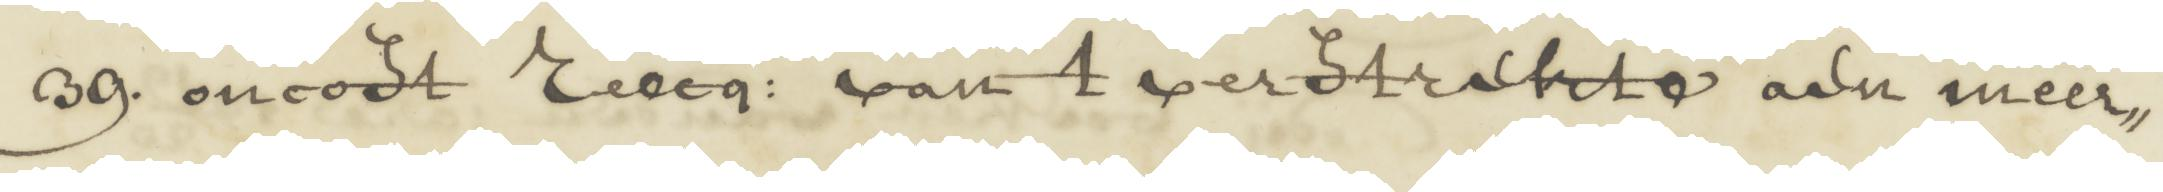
39. oncost reecq: van ’t verstrekte aen meer„
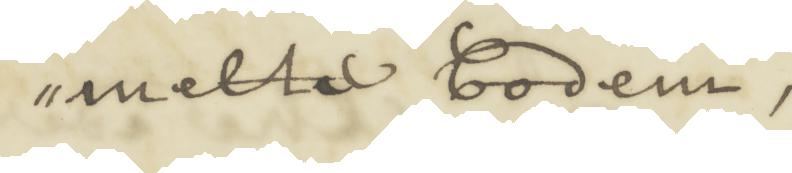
„melte bodem,
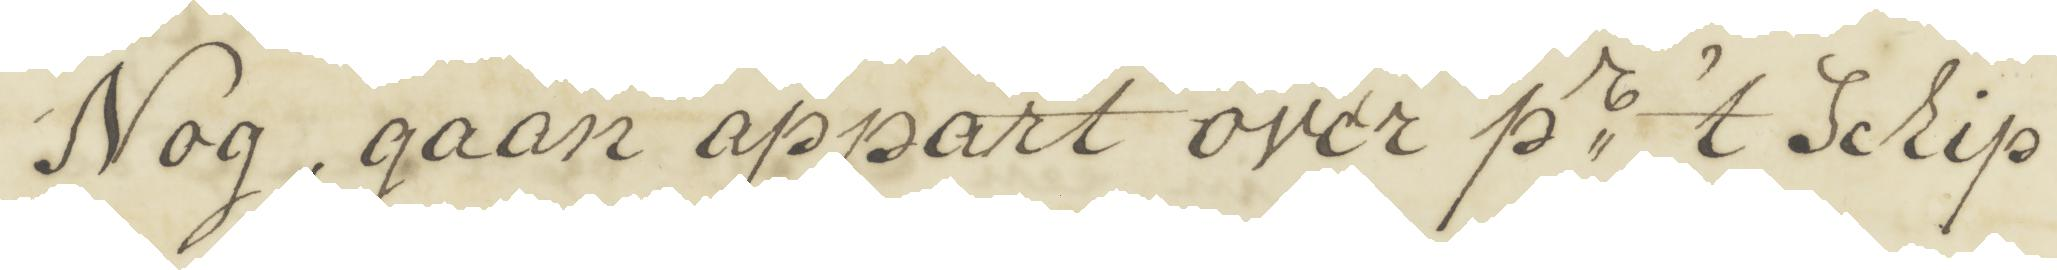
Nog gaan appart over p„r ’t schip
